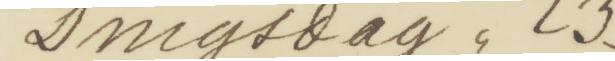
Dingsdag „ 23
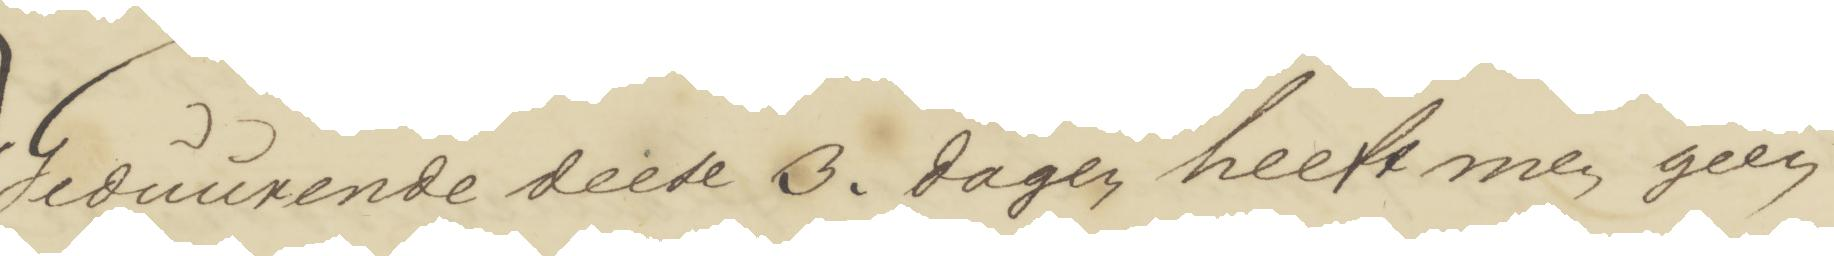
Geduurende deese 3. dagen heeft men geen
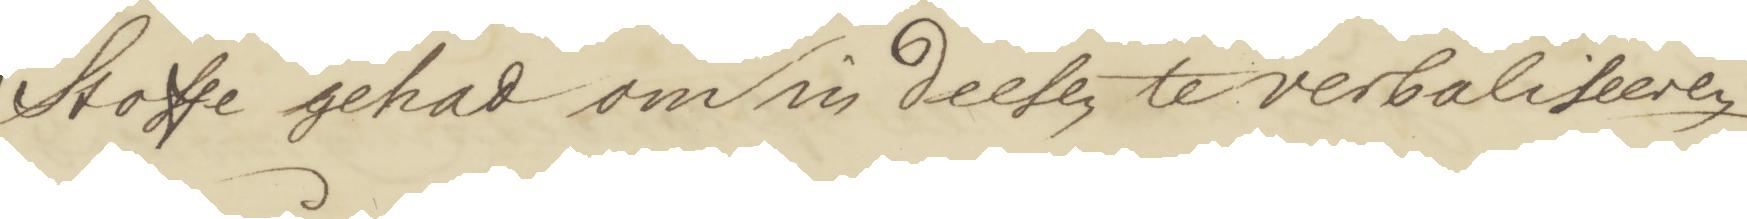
stoffe gehad om in deesen te verbaliseeren
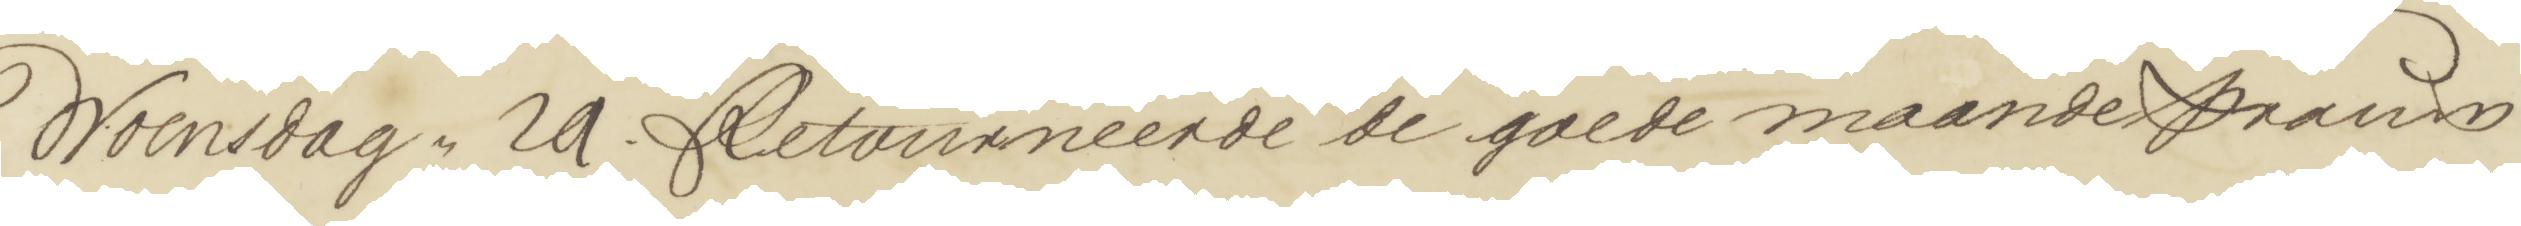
Woensdag „ 24. Retourneerde de goede maande prauw
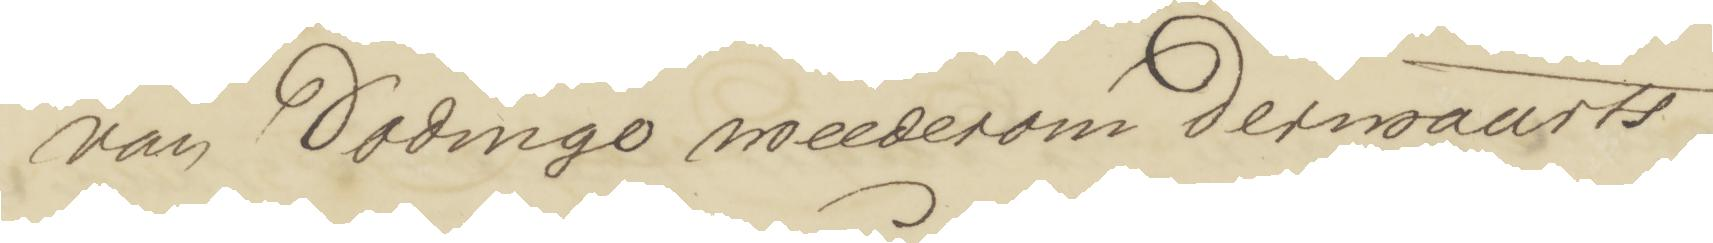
van Dodingo weederom derwaarts
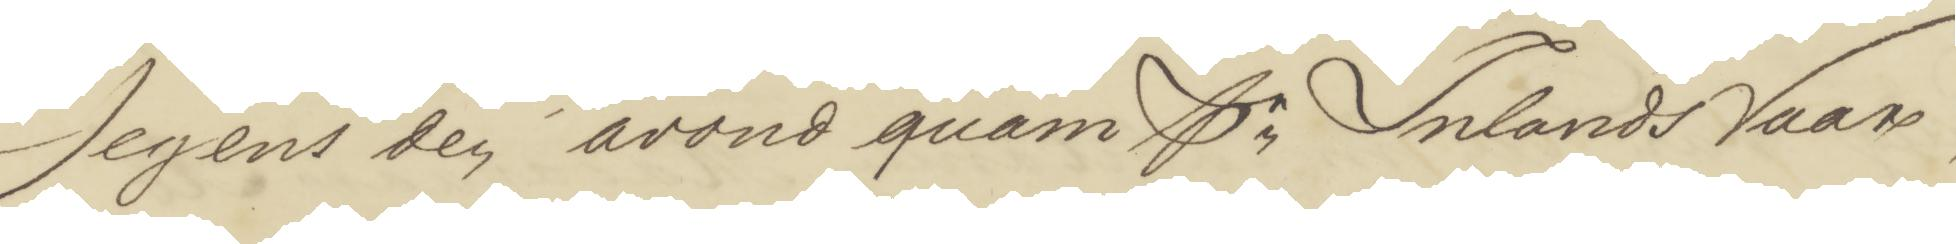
Jegens den avond quam p„r Inlands Vaar
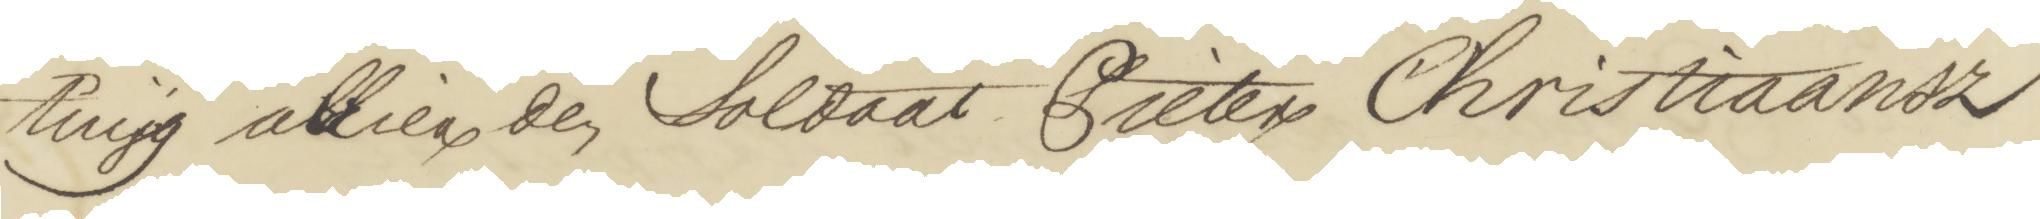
tuijg alhier den soldaat Pieter Christiaansz
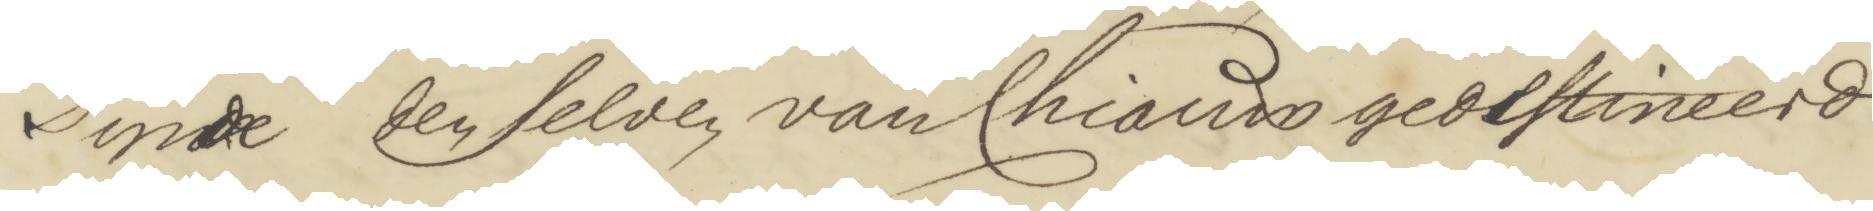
sijnde denselven van Chiauw gedestineerd
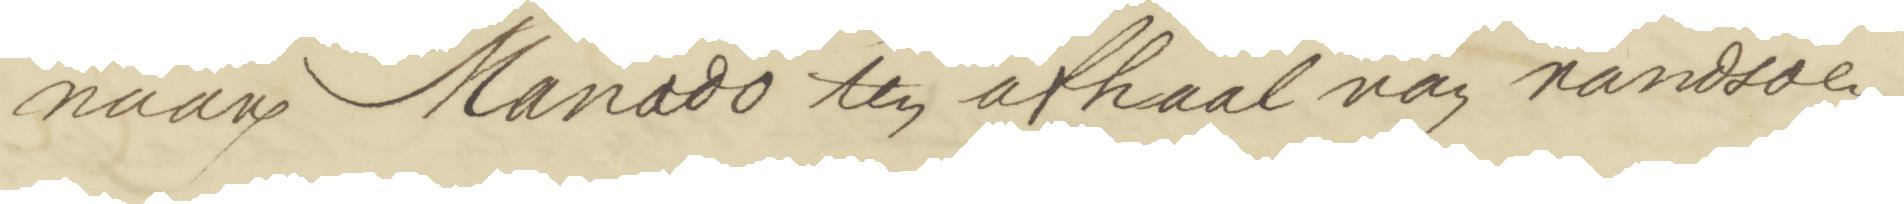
naar Manado ten afhaal van randsoen
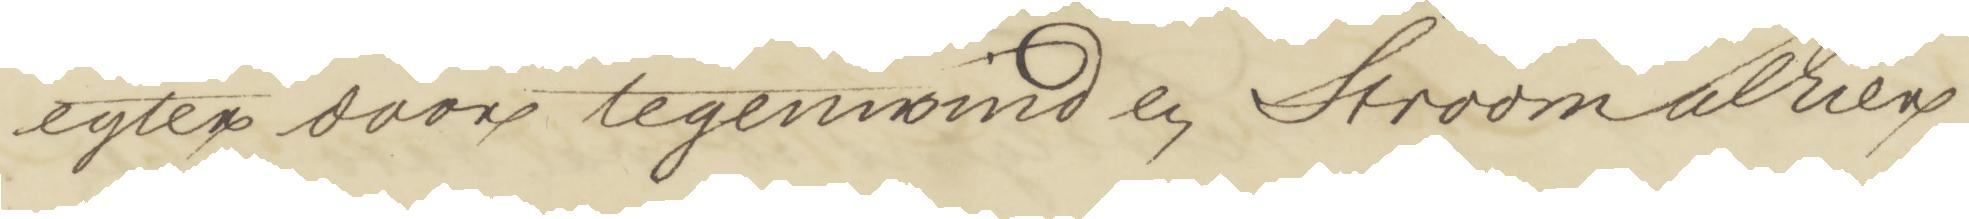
egter door tegenwind en stroom alhier
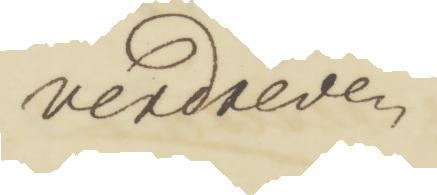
verdreven
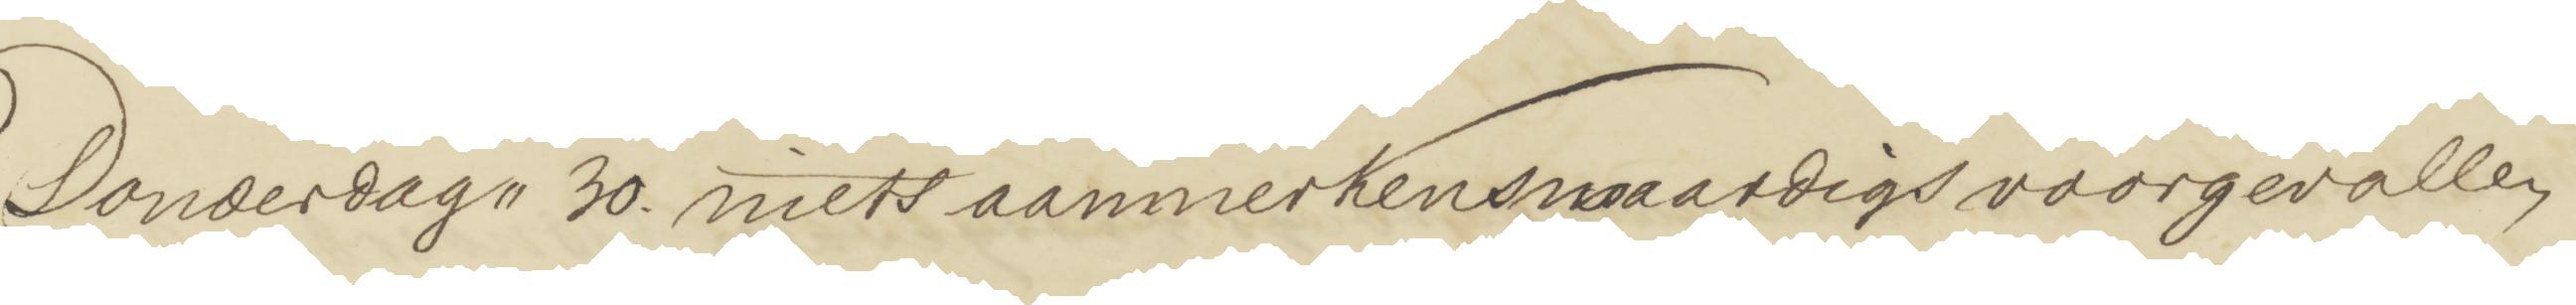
Donderdag „ 30. niets aanmerkenswaardigs voorgevallen
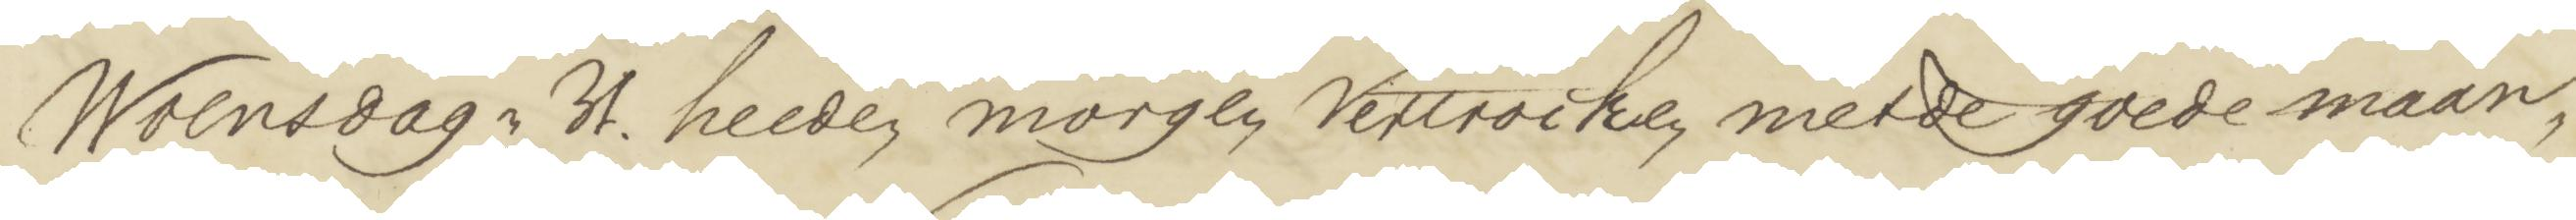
Woensdag „ 31. heeden morgen vertrocken met de goede maan„
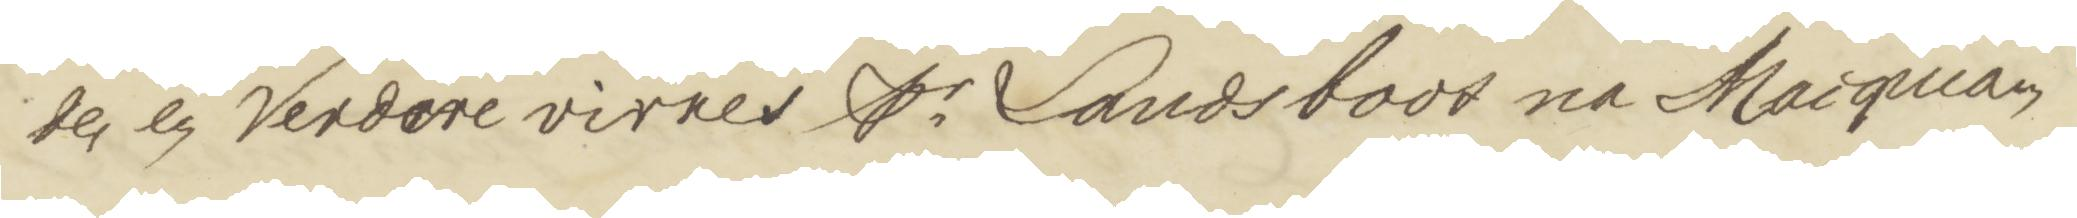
de en verdere virres p„r Landsboot na Macquian
